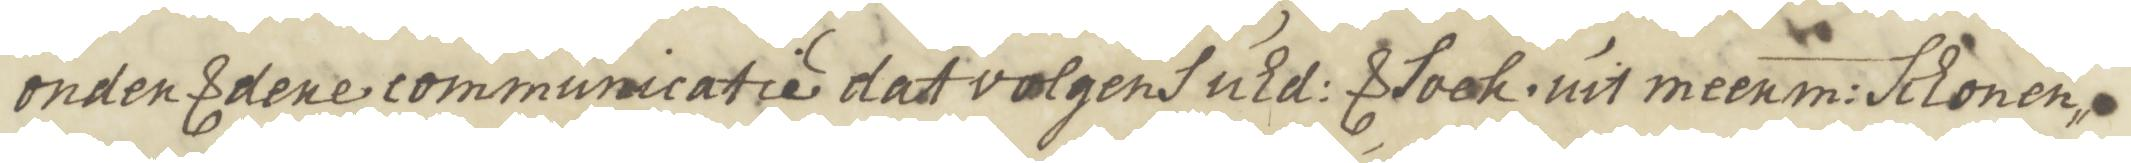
onder verdere communicatie dat volgens uEd: versoek uit meerm: schonen„
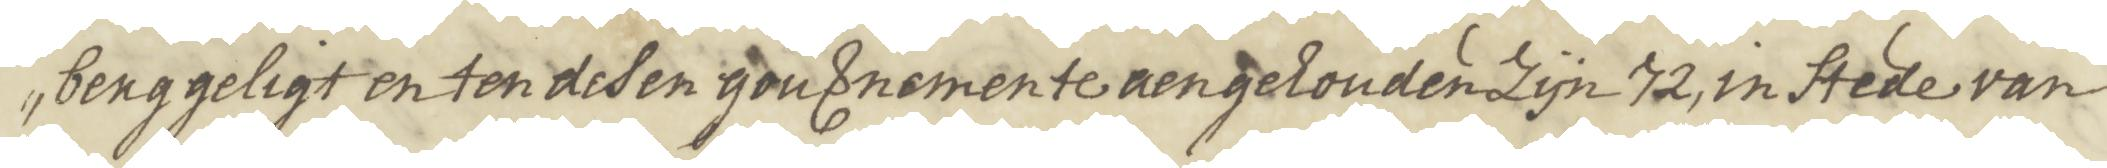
„berg geligt en ten desen gouvernemente aengehouden zijn 72, in stede van
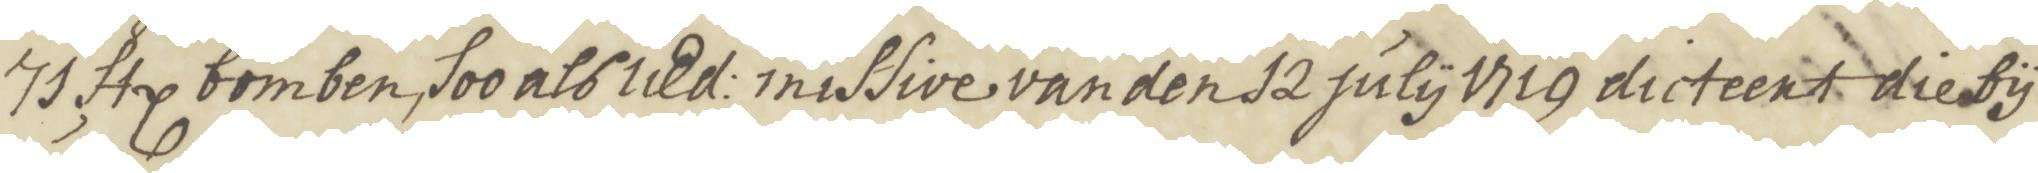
71 stx bomben, soo als uEd: missive van den 12 julij 1719 dicteert die bij
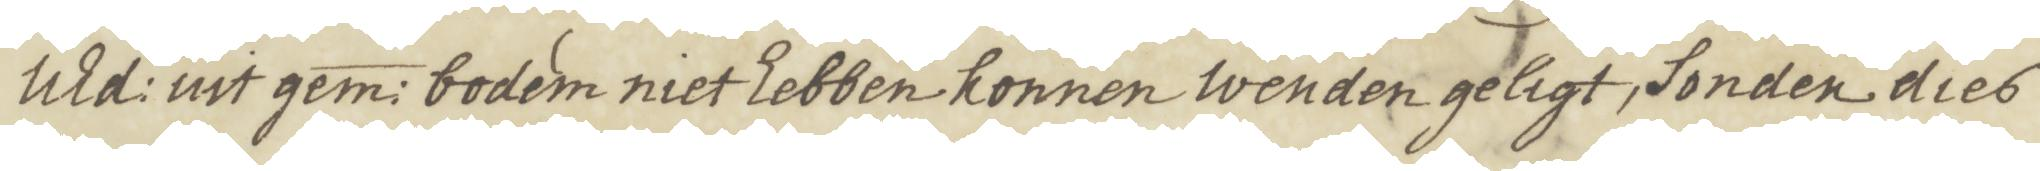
uEd: uit gem: bodem niet hebben konnen werden geligt, sonder dies
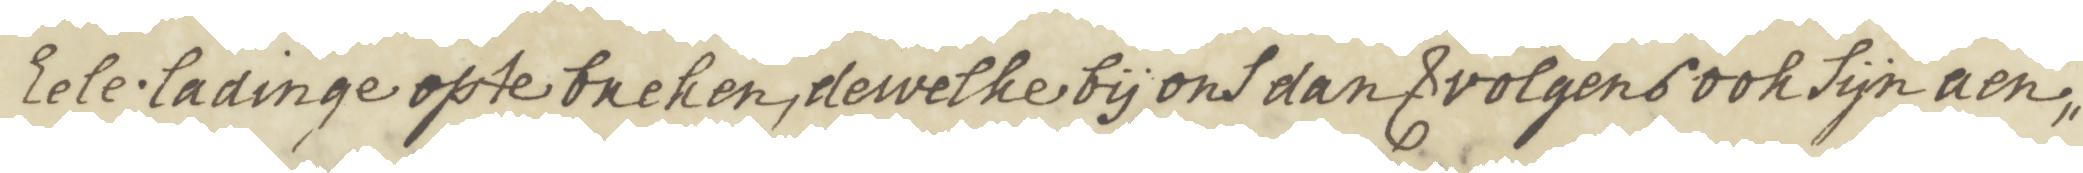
hele ladinge op te breken, dewelke bij ons dan vervolgens ook sijn aen„
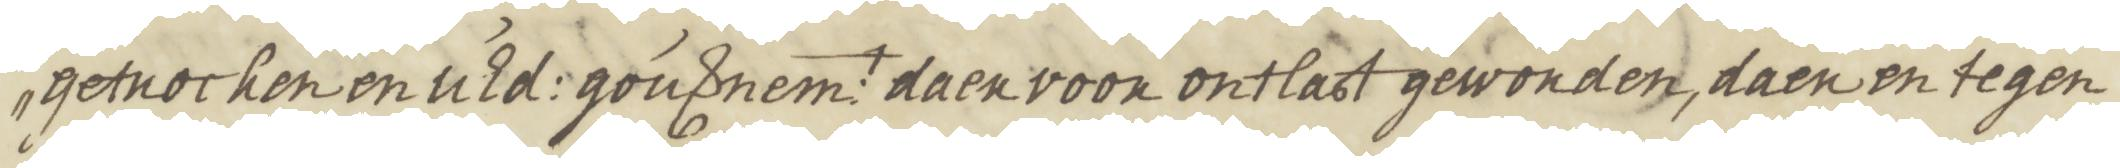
„getrocken en uEd: gouvernem:t daer voor ontlast geworden, daer en tegen
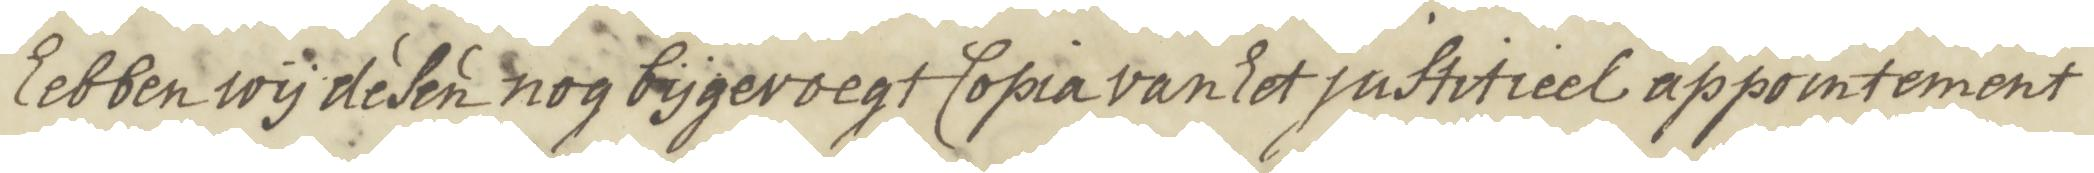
hebben wij desen nog bij gevoegt Copia van het justitieel appointement
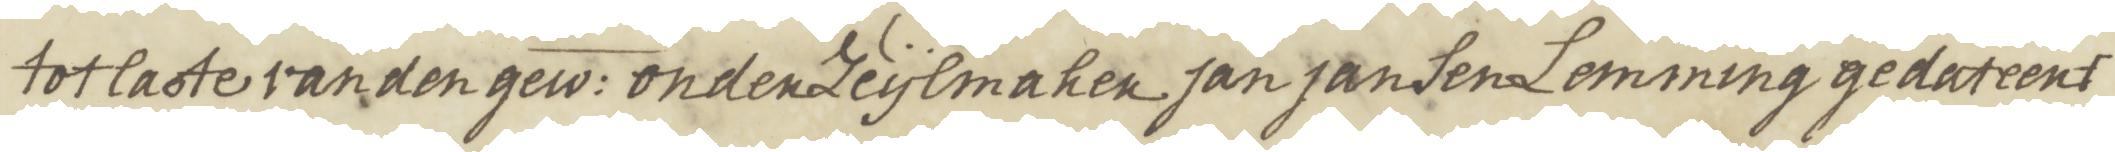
tot laste van den gew: onderzeijlmaker jan jansen Lemming gedateert
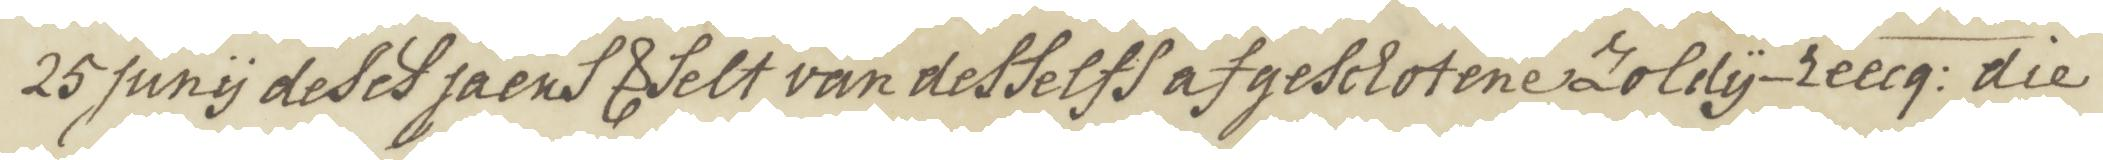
25 junij deses jaers verselt van desselfs afgeschotene zoldij reecq: die
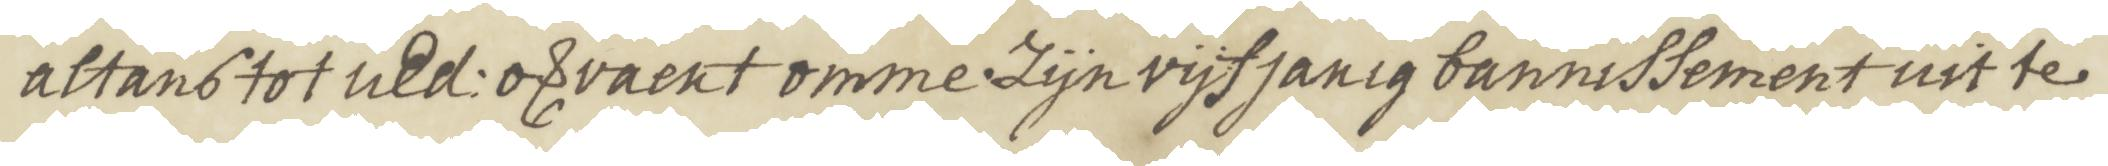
altans tot uEd: overvaert omme zijn vijf jarig bannissement uit te
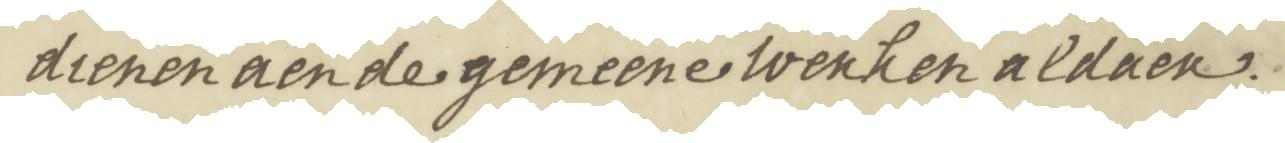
dienen aen de gemeene werken aldaer.
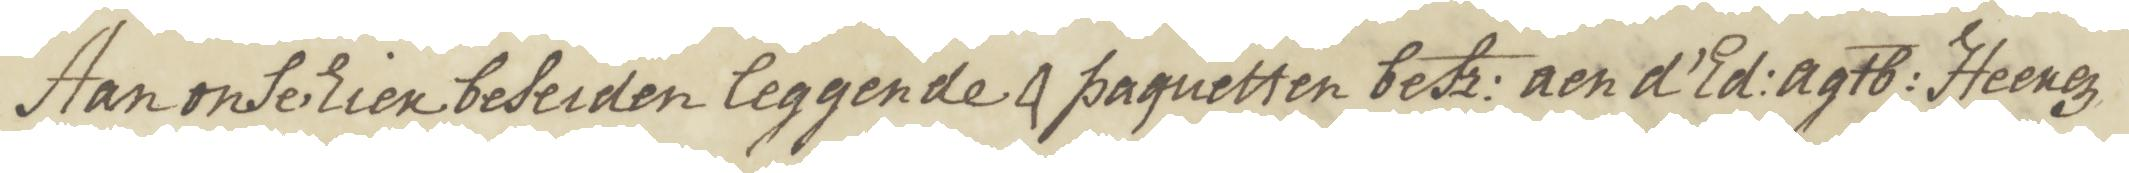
Aan onse hier beseiden leggende 4 paquetten besz: aen d’ Ed: agtb: Heeren
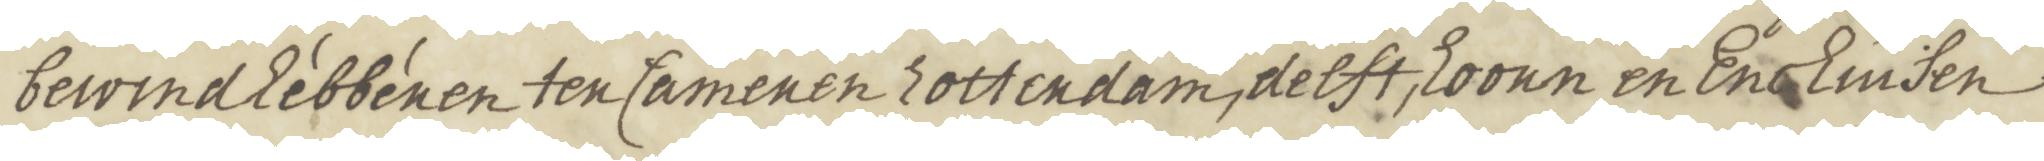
bewindhebberen ter Cameren rotterdam, delft, hoorn en Enchuisen
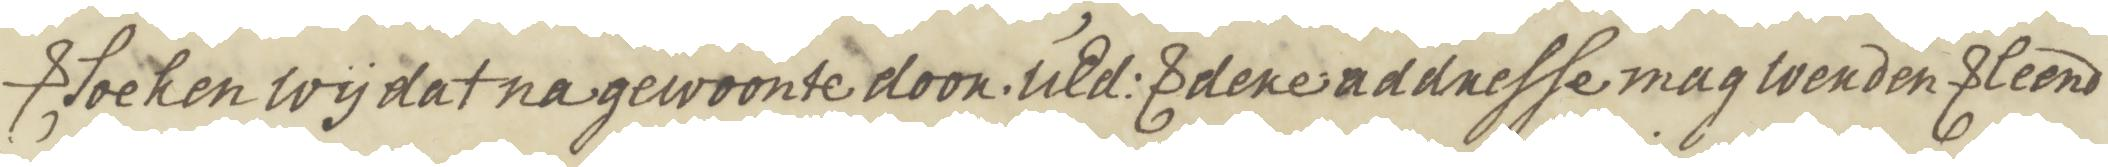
versoeken wij dat na gewoonte door. uEd: verdere addresse mag werden verleend
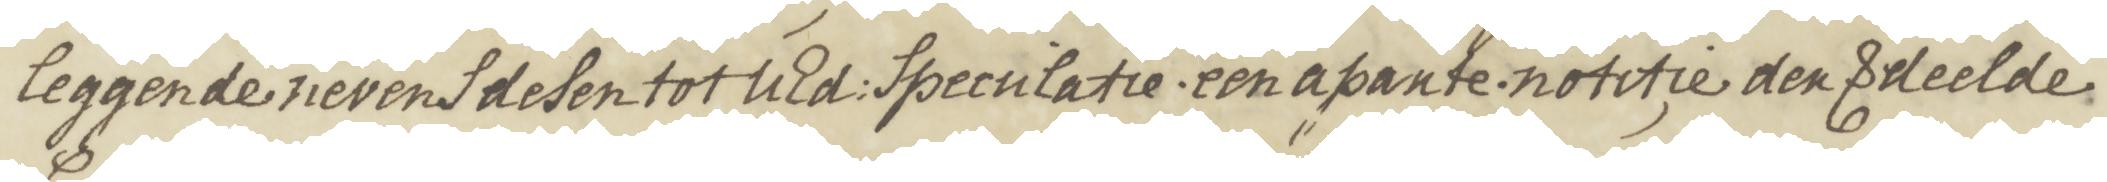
leggende nevens desen tot uEd: speculatie een aparte notitie der verdeelde
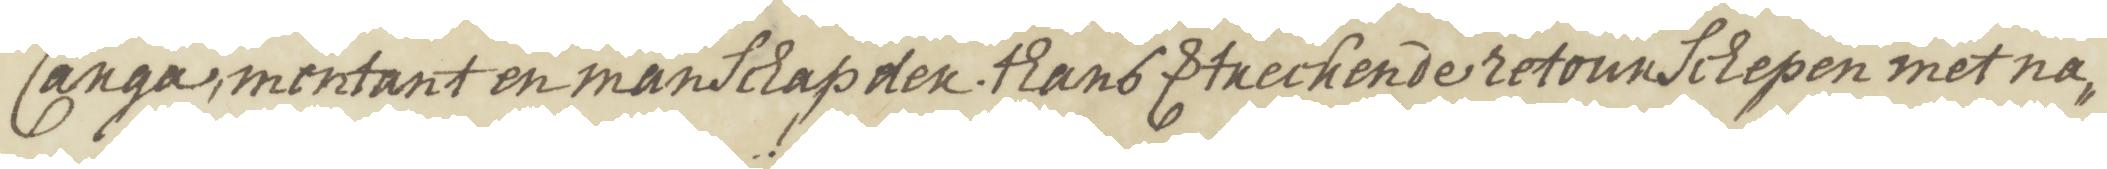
Canga, montant en manschap der thans vertreckende retour schepen met na„
